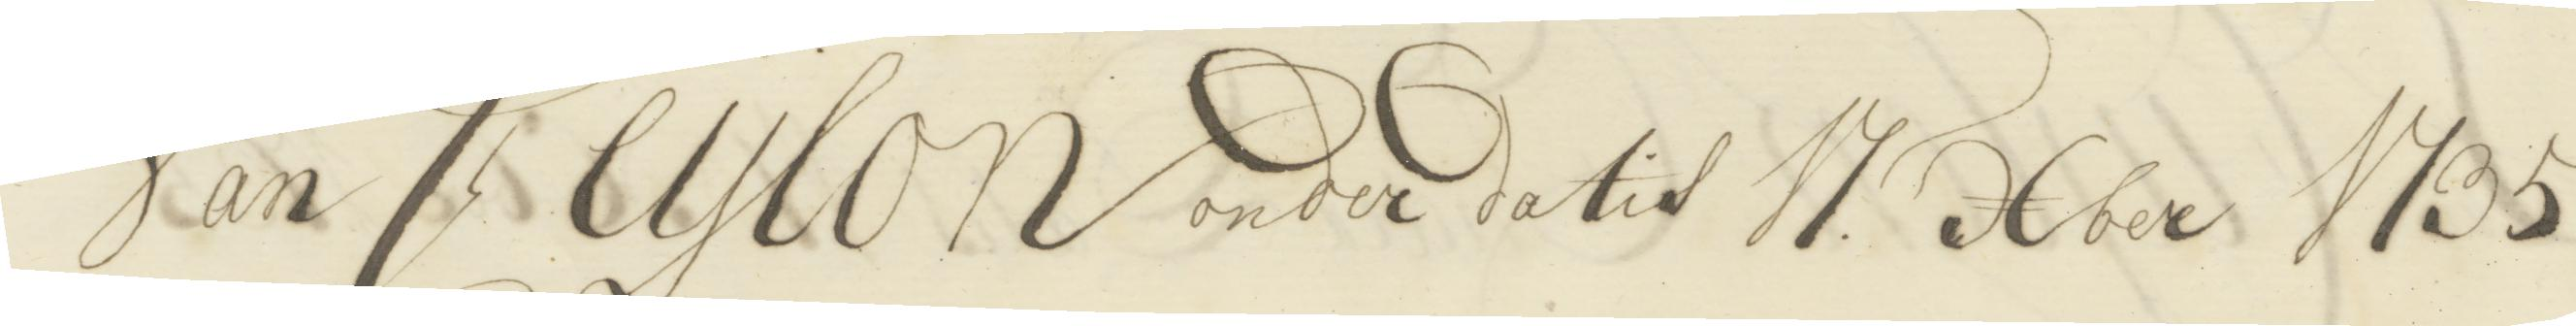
Van Ceijlon onder datis 17' Xber 1735
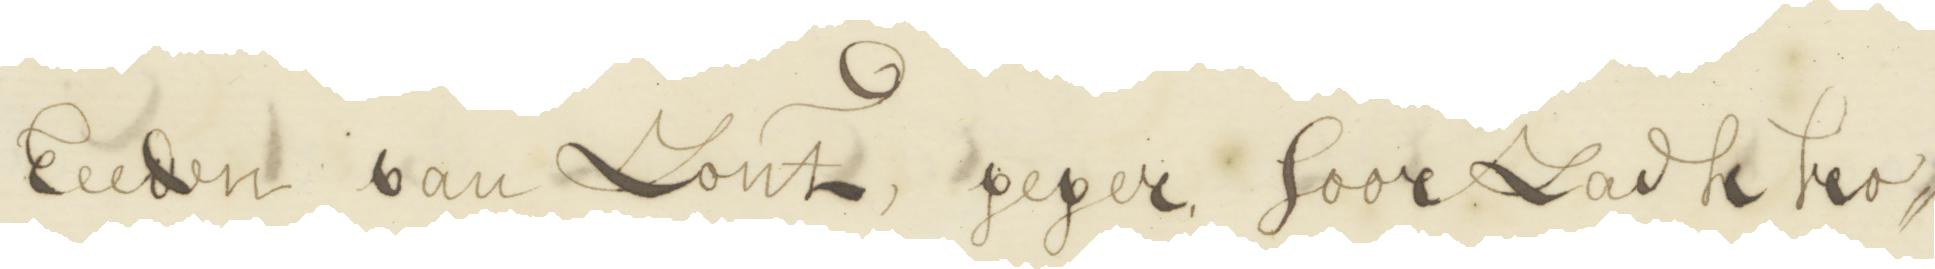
heeden van Zout, peper Soor Zaek ko
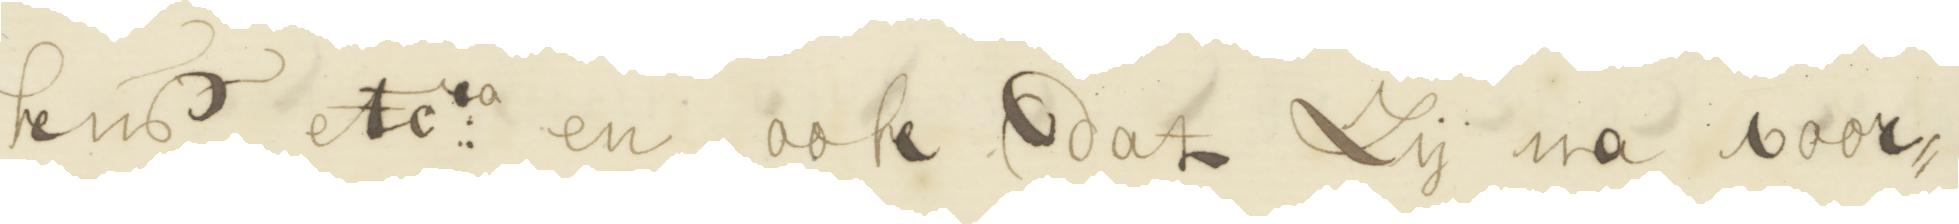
kus etc:ra en ook dat Zij na voor„
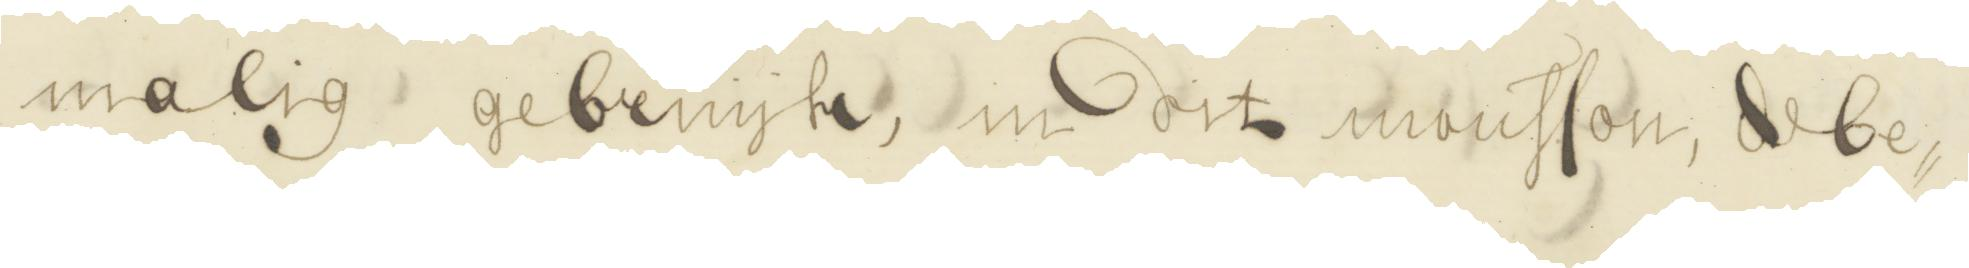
malig gebruijk, in dit mousson, de be„
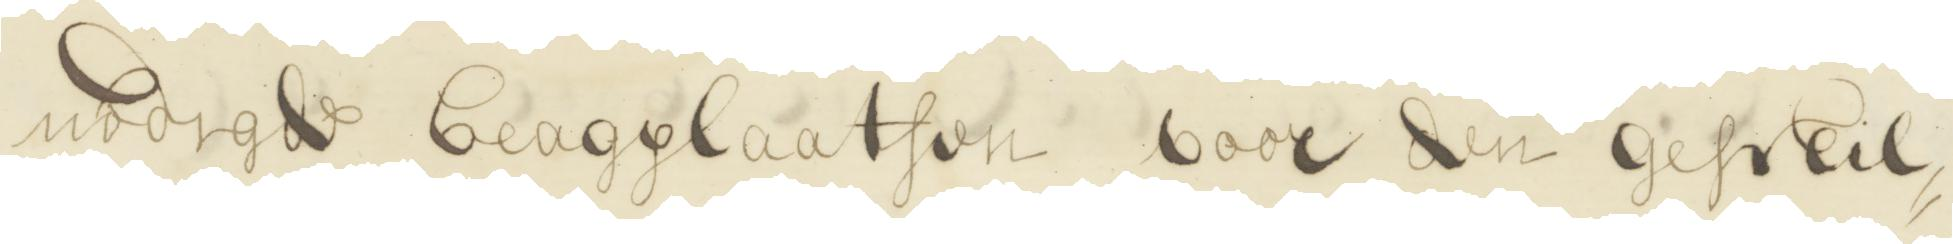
nodigde bergplaatsen voor den geschil„
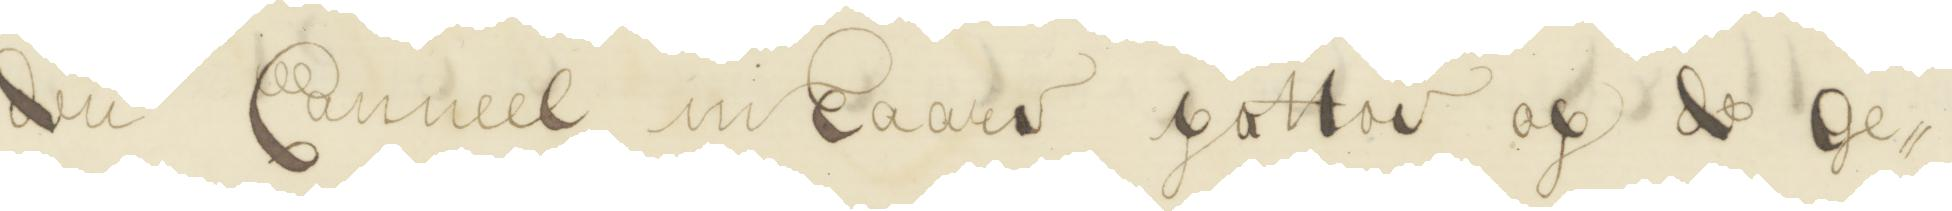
den Canneel in haare pattoe op de ge„
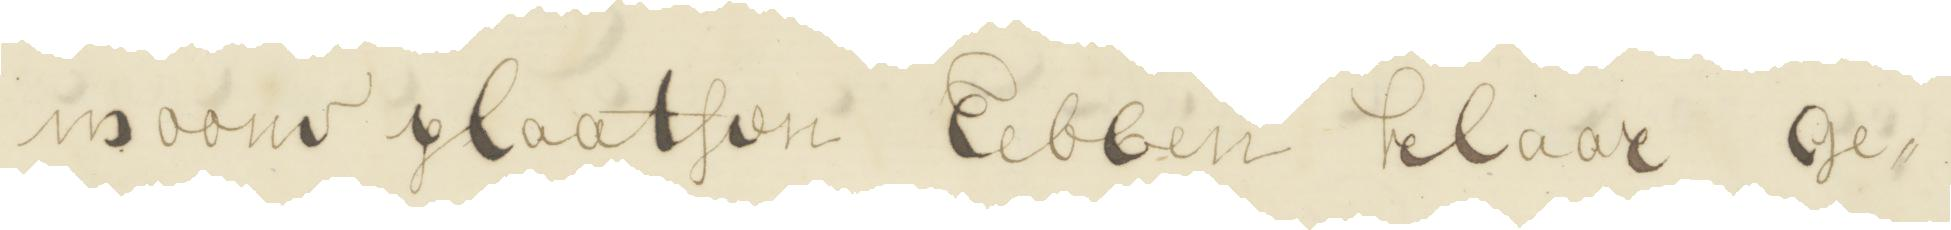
woone plaatsen hebben klaar ge„
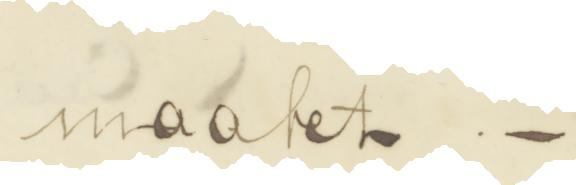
maakt. —
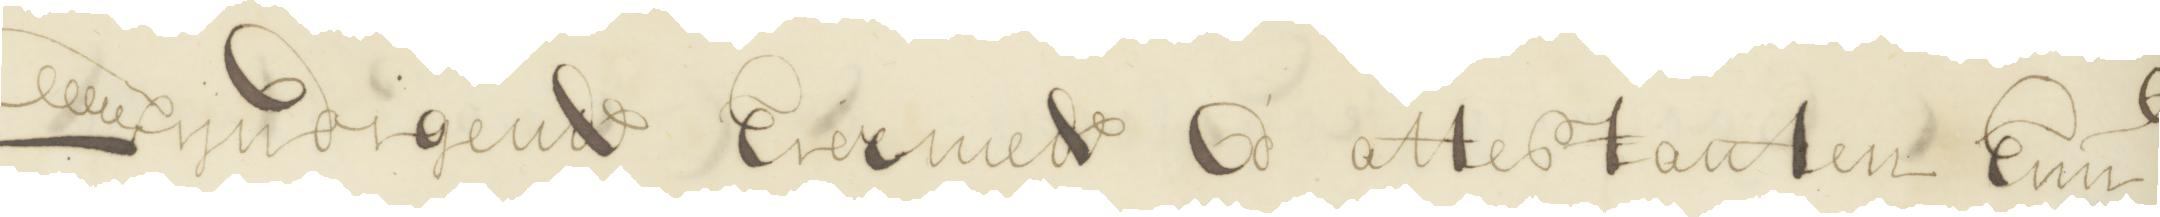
Eijndigende hiermede d' attestanten hun
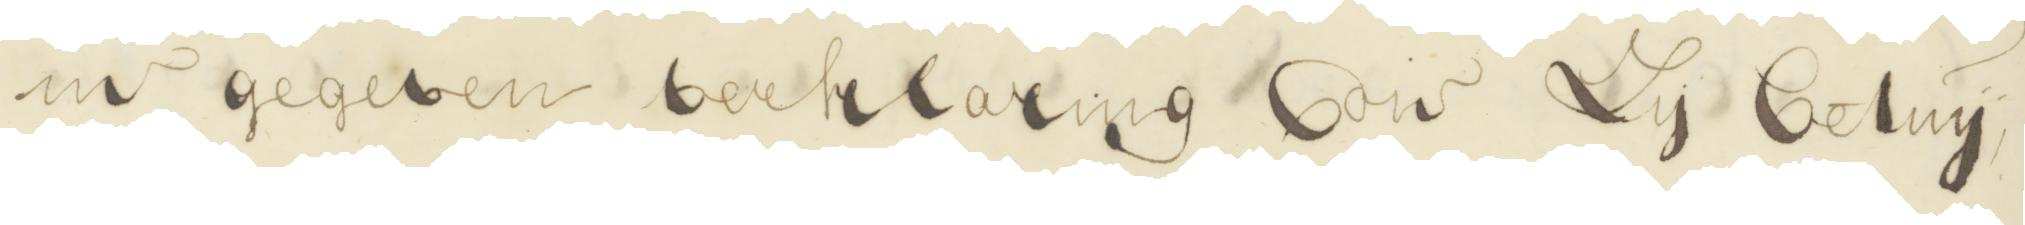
ne gegeven verklaring die Zij betuij„
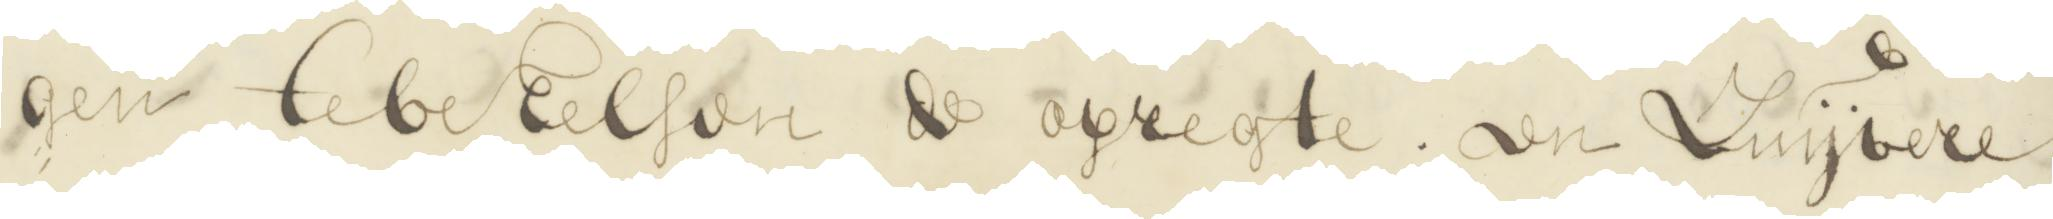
gen te behelsen de opregte en Zuijvere
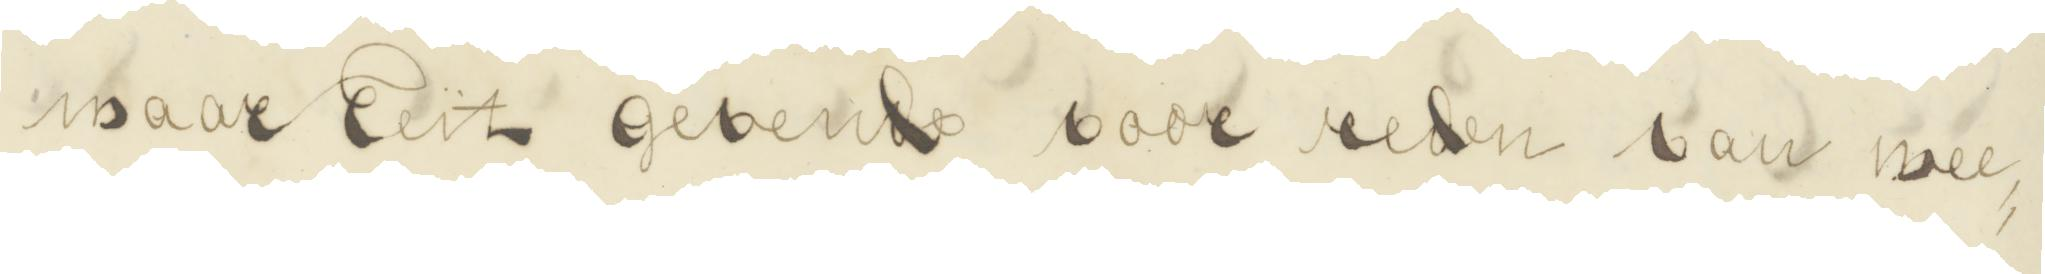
waarheit gevende voor reden van wee„
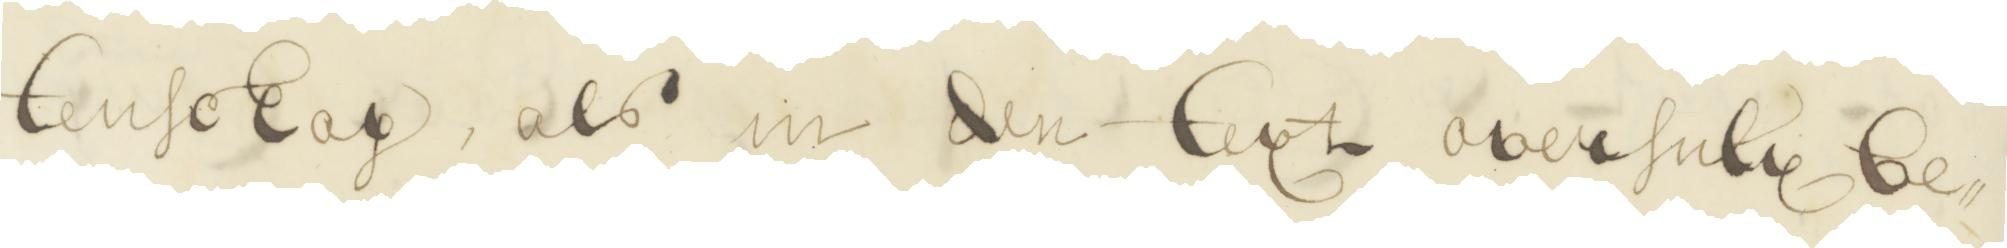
tenschap, als in den text oversulx be„
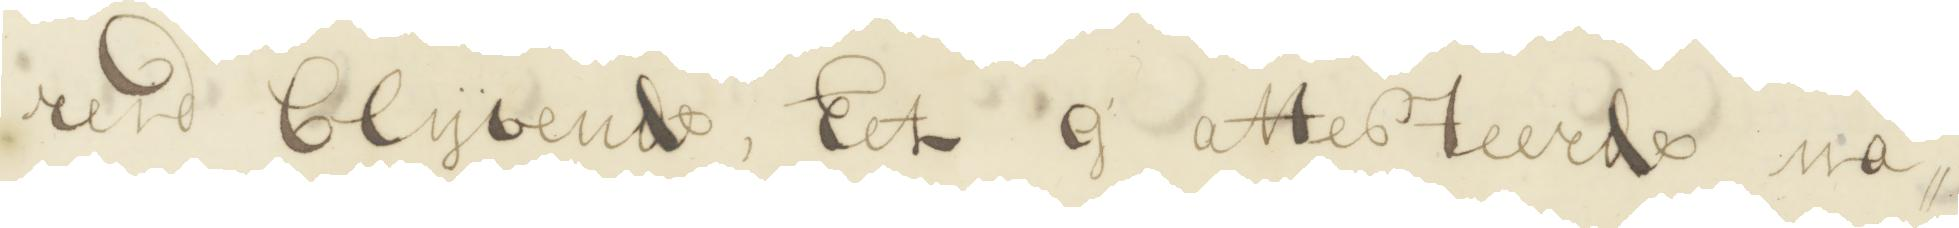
reid blijvende, het g’attesteerde na„
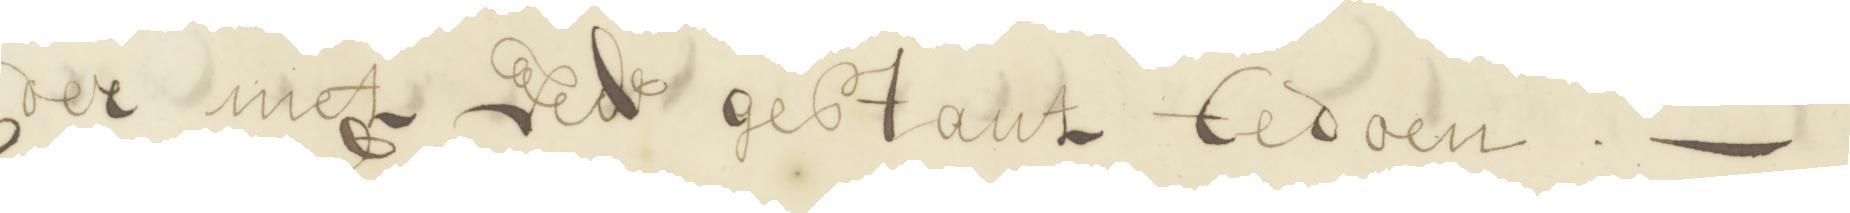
der met Eede gestant te doen. —
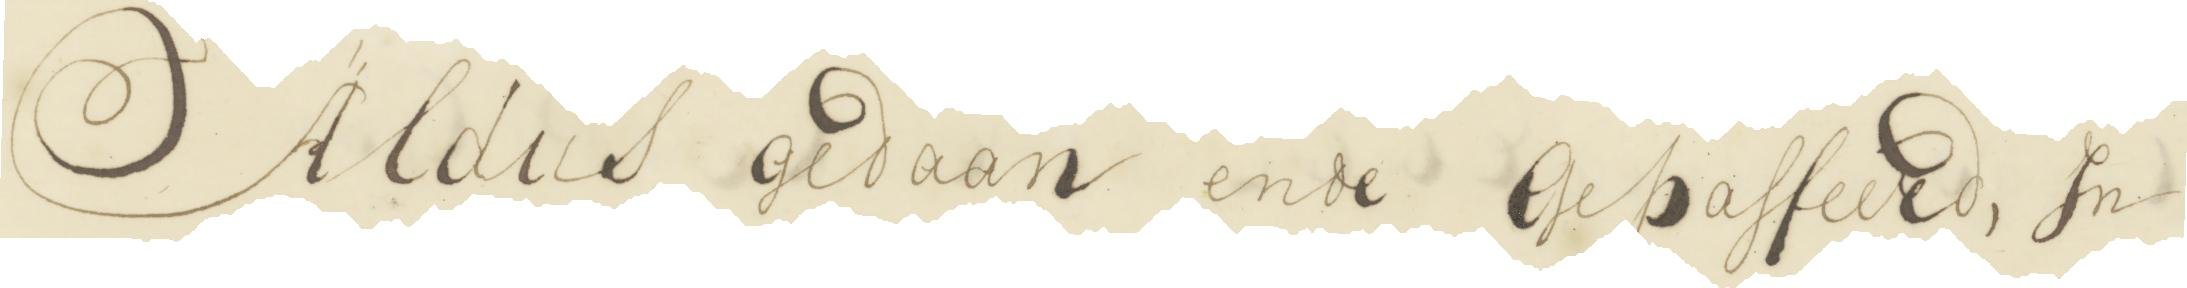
Aldus gedaan ende gepasseerd, In
